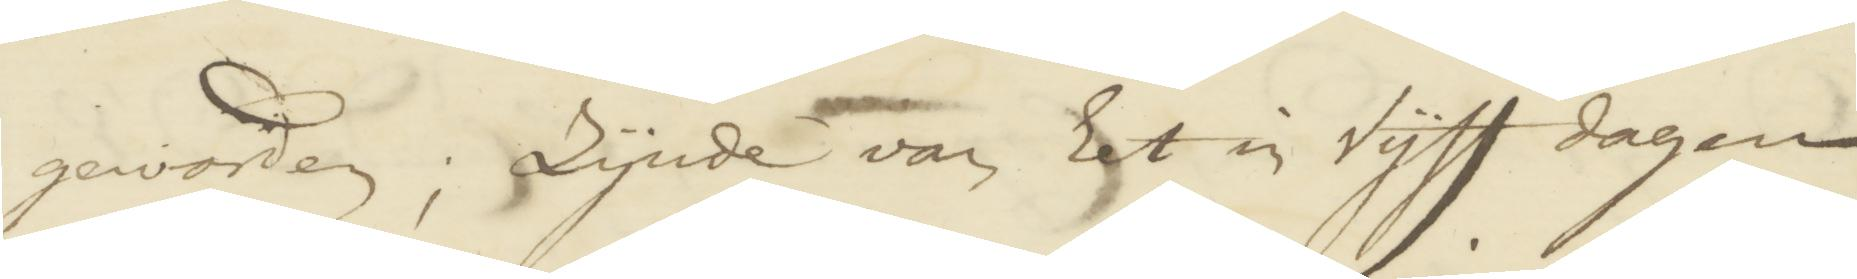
geworden; zijnde van het in vijff dagen
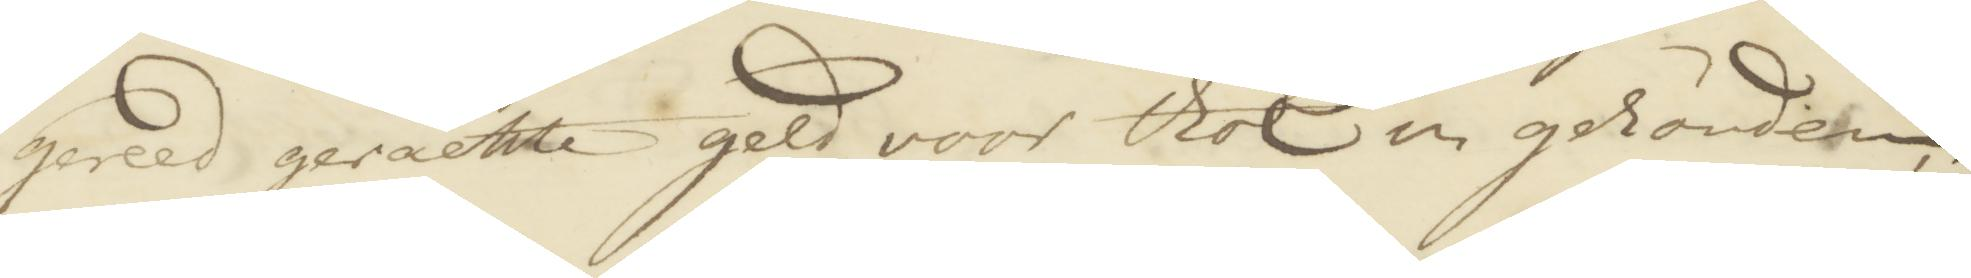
gereed geraekte geld voor thol en gehouden,
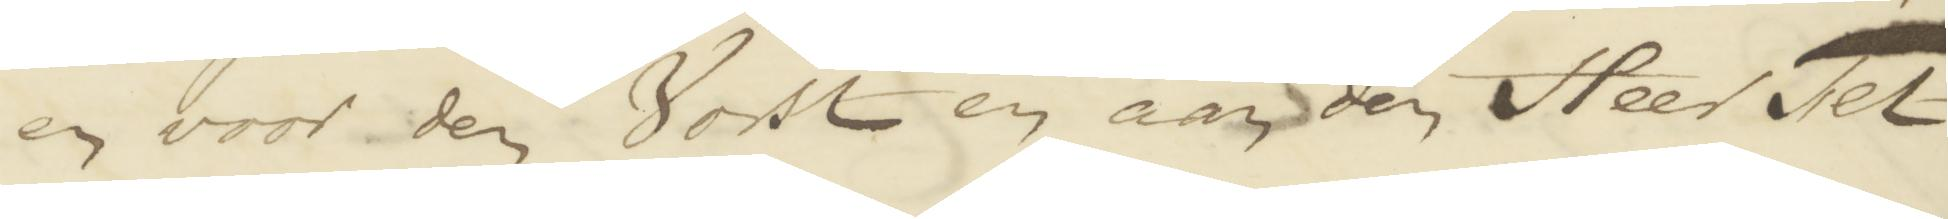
en voor den Vorst en aan den Heer Fet
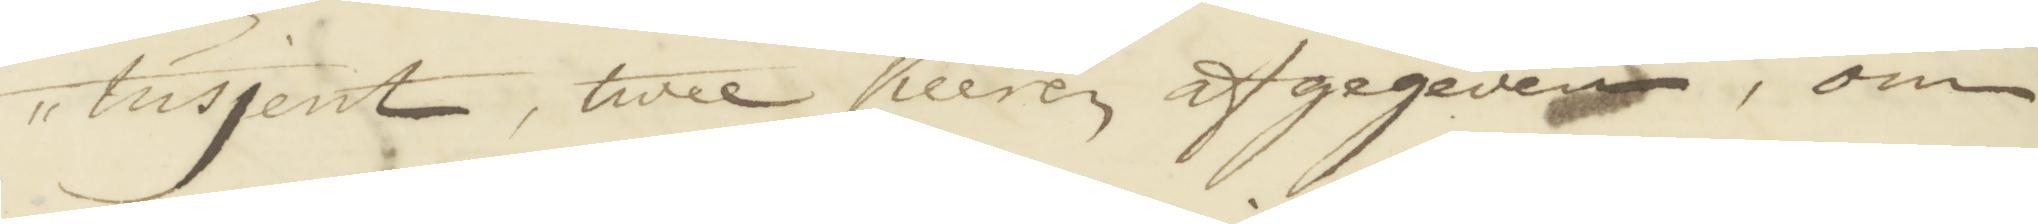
„tusjent, twee heeren afgegeven, om
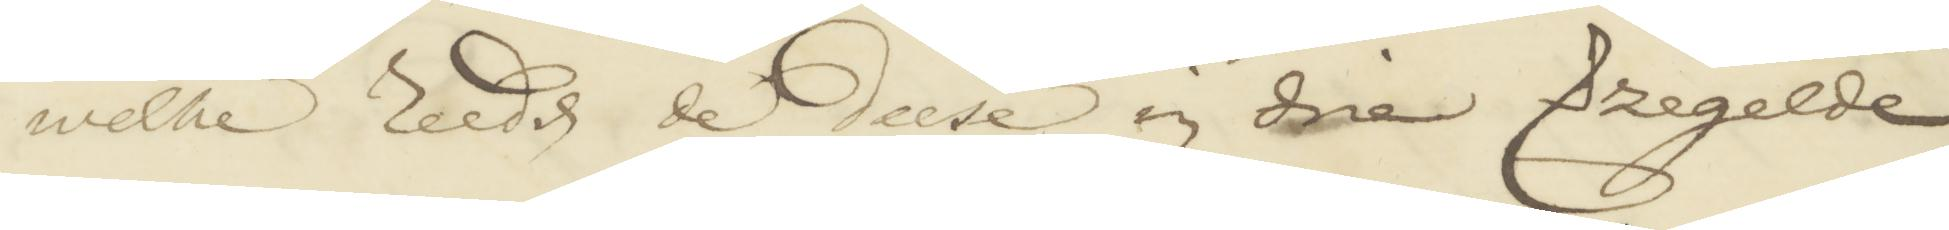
welke reeden de deese in de verzegelde
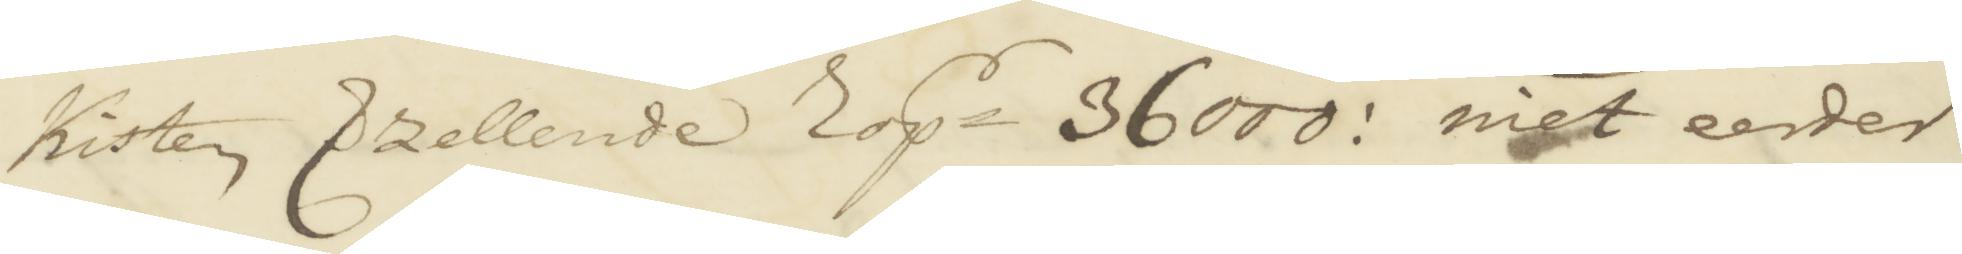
kisten verzellende rop=s 36000: niet eerder
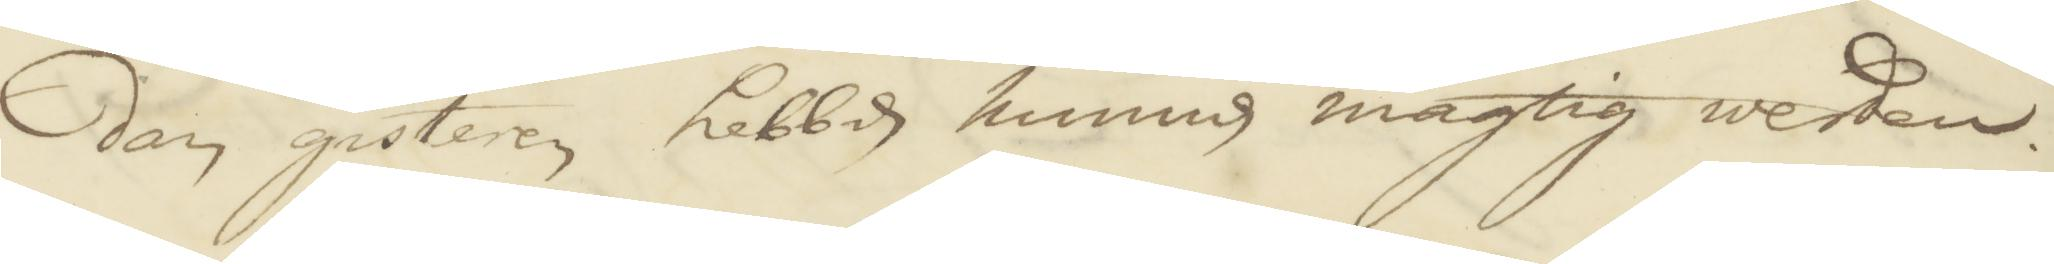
dan gisteren hebben kunnen magtig werden.
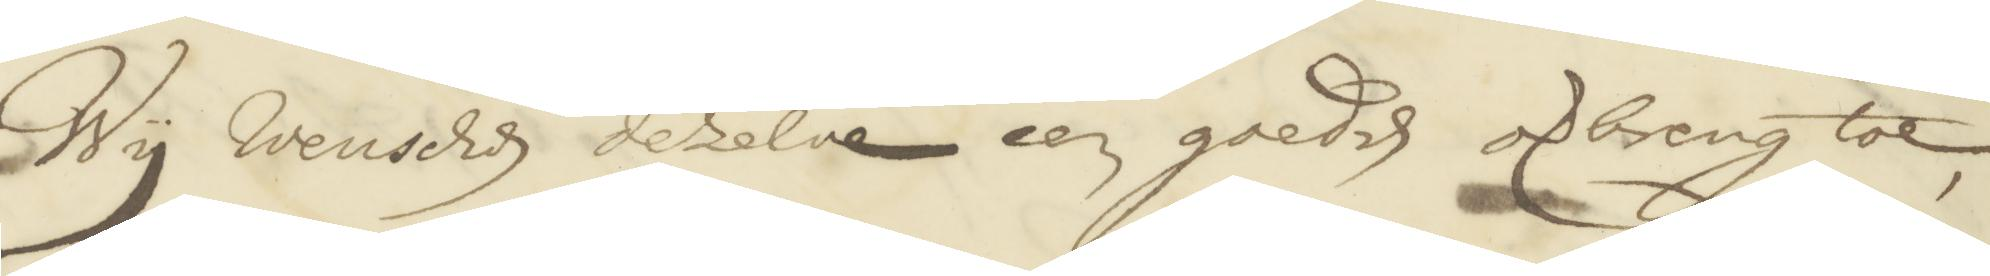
Wij wenschen dezelve een goeden overbreng toe
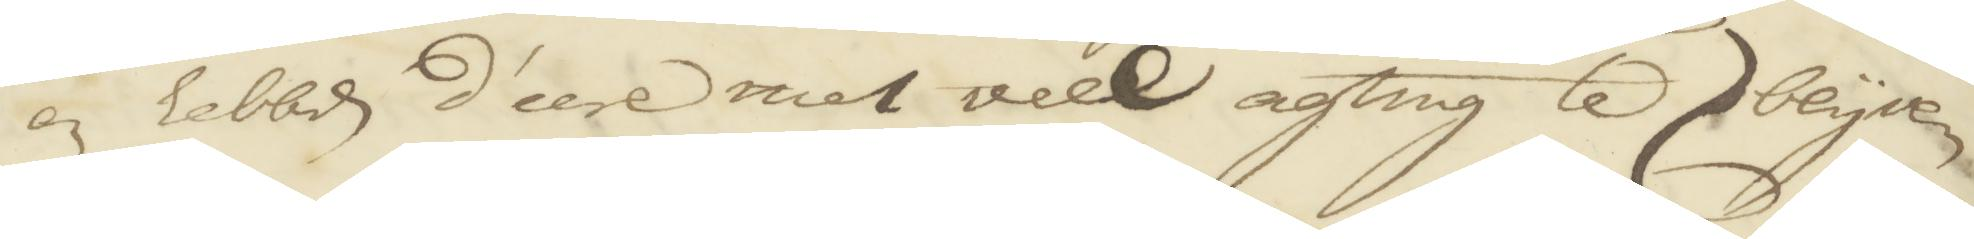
en hebben d’eere met veel agting te verblijven
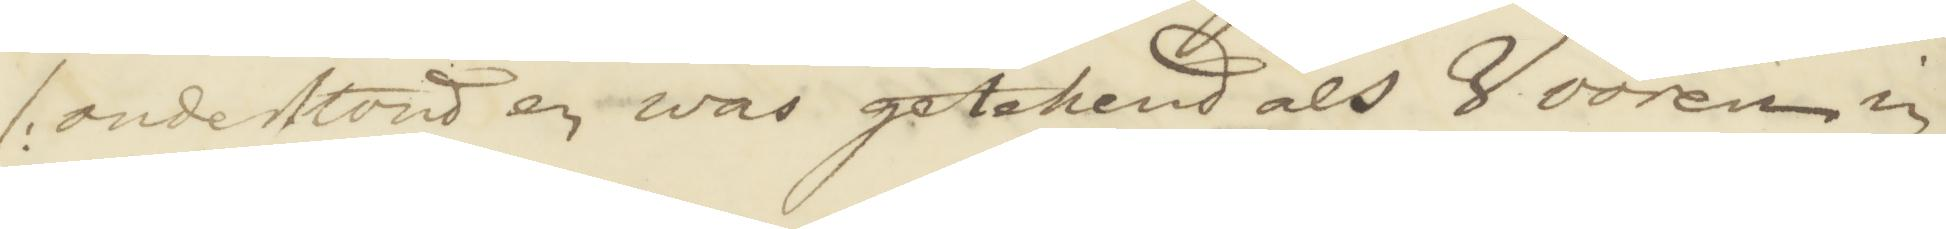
(:onderstond en was getekend als Vooren in
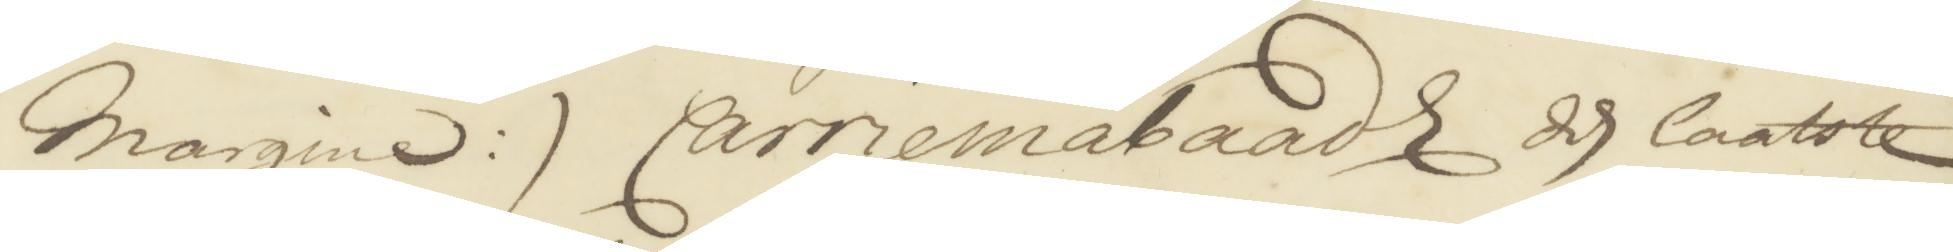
margine:) Carriemabaadh den laatste
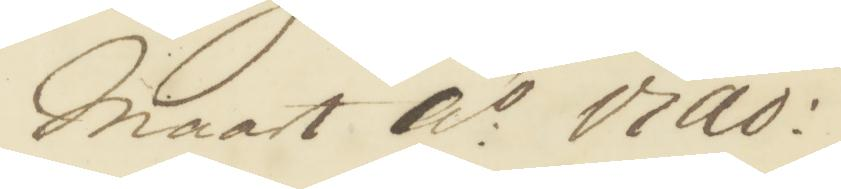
maart a:o 1740:
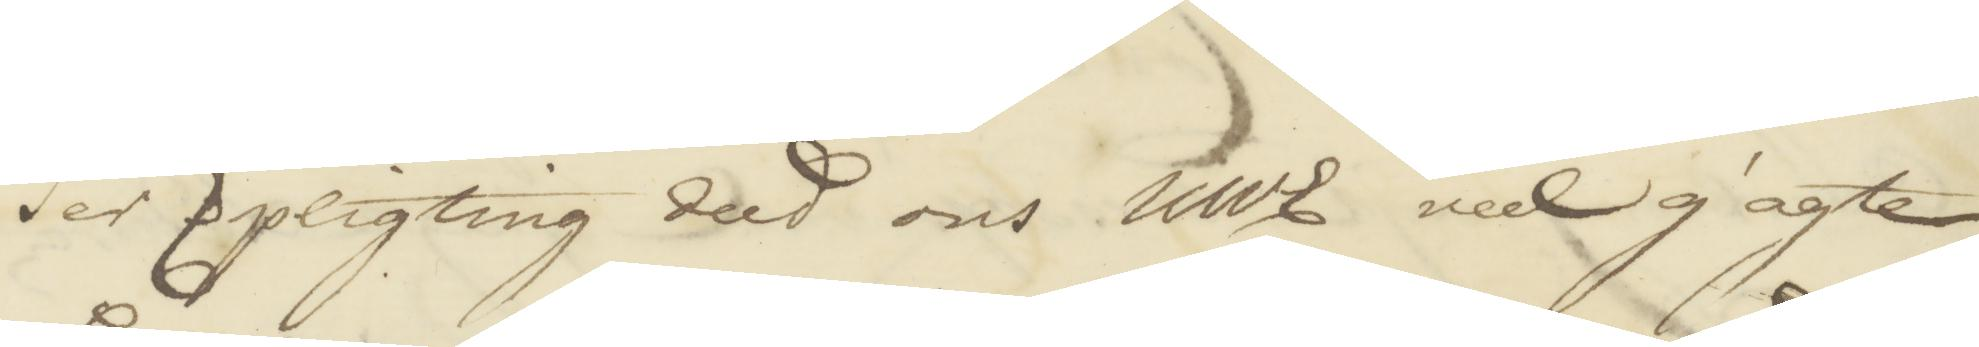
Ter verpligting deed ons uwE veel g’agte
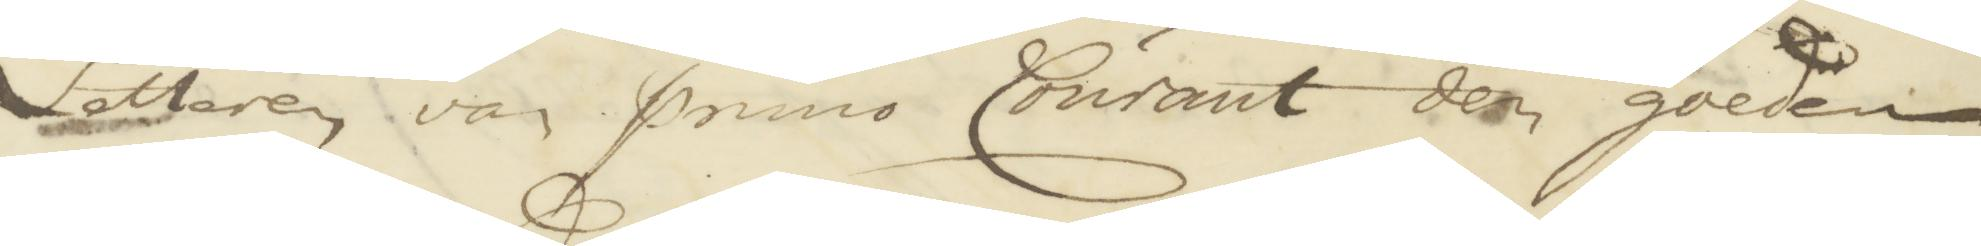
Letteren van primo Courant den goeden
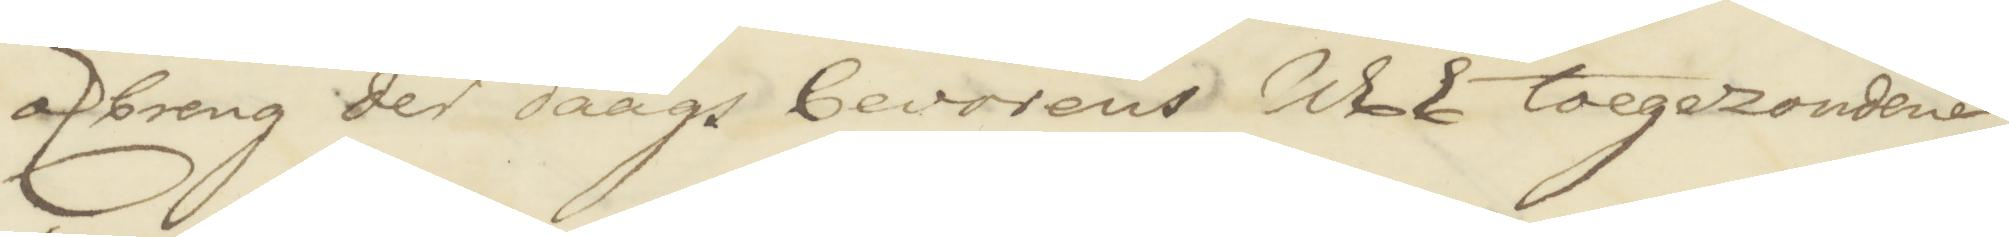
overbreng der daags bevorens UEE toegezondene
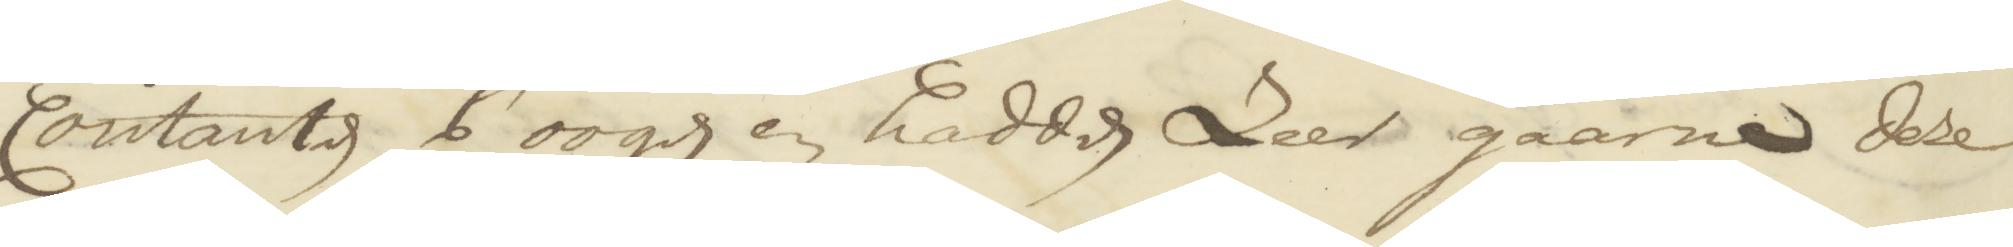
Contanten b'oogen en hadden zeer gaarne deze
